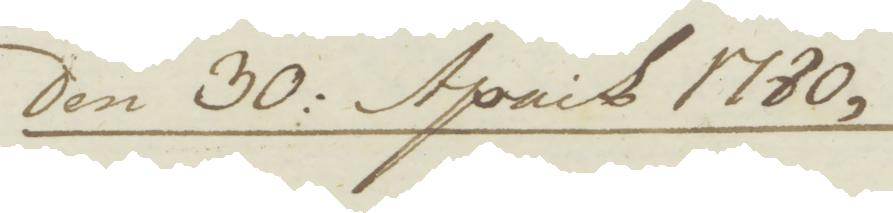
den 30: April 1780,
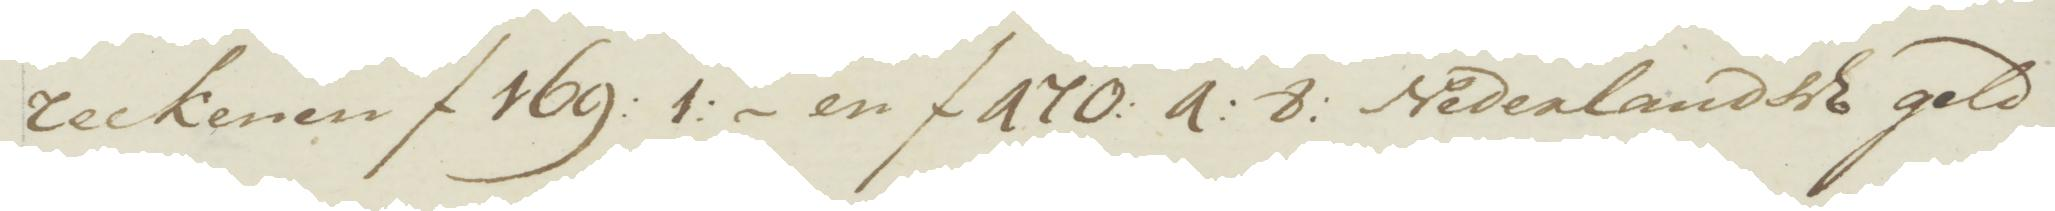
reekenen ƒ169: 1: – en ƒ470: 4: 8: Nederlandsch geld
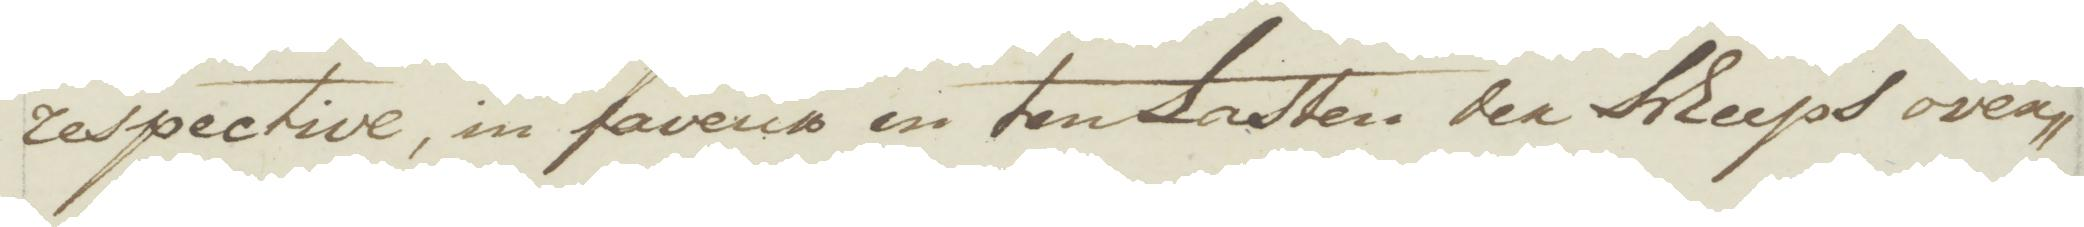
respective, in faveur en ten lasten der scheeps over„
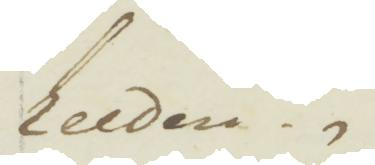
heeden. -
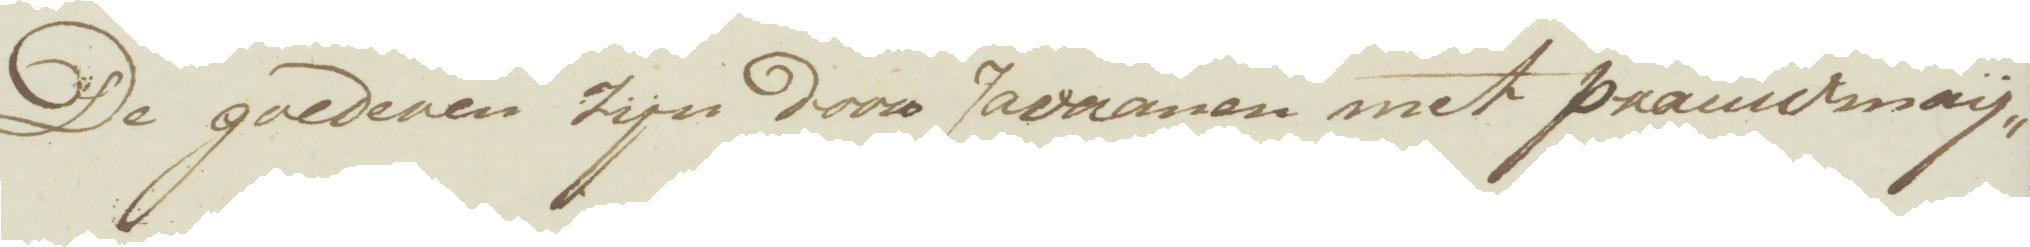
De goederen zijn door Javaanen met prauwmaij„
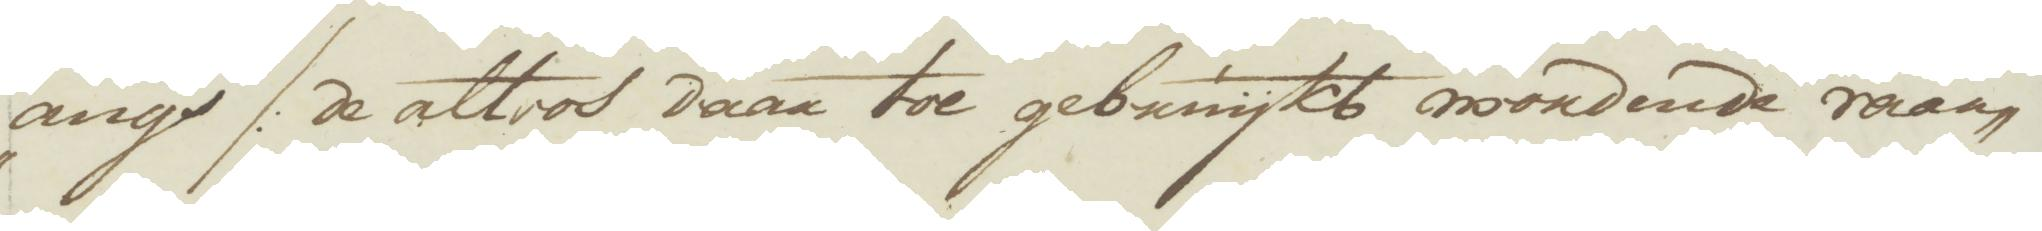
angs /: de altoos daar toe gebruijkt wordende vaar„
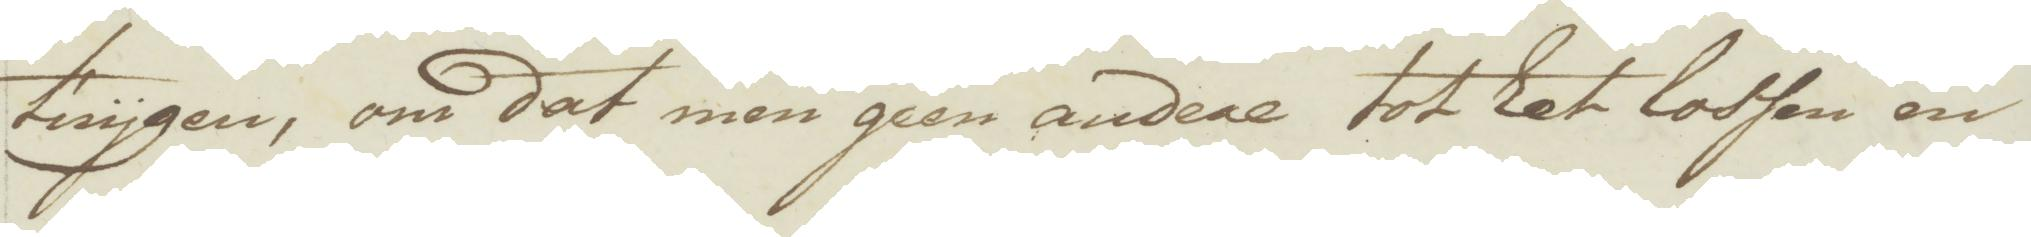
tuijgen, om dat men geen andere tot het lossen en
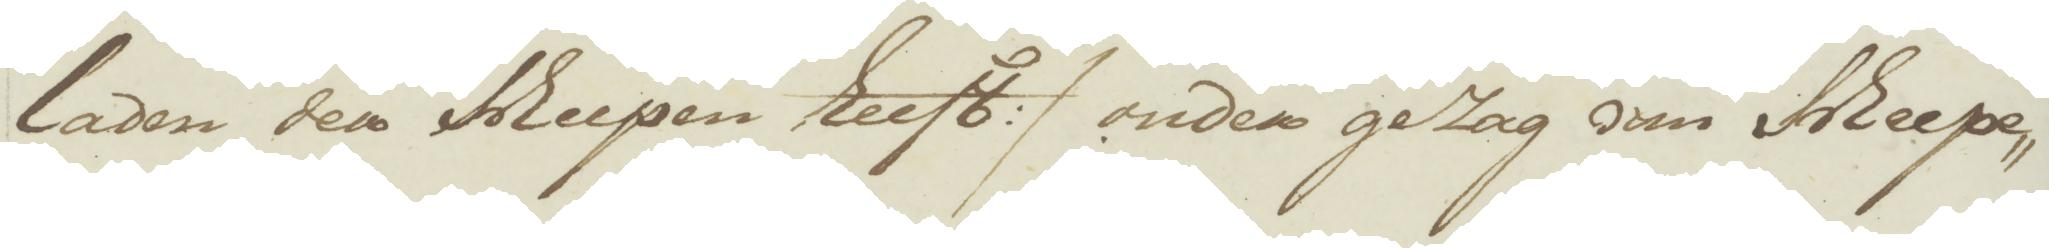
laden der scheepen heeft:/ onder gezag van scheepe„
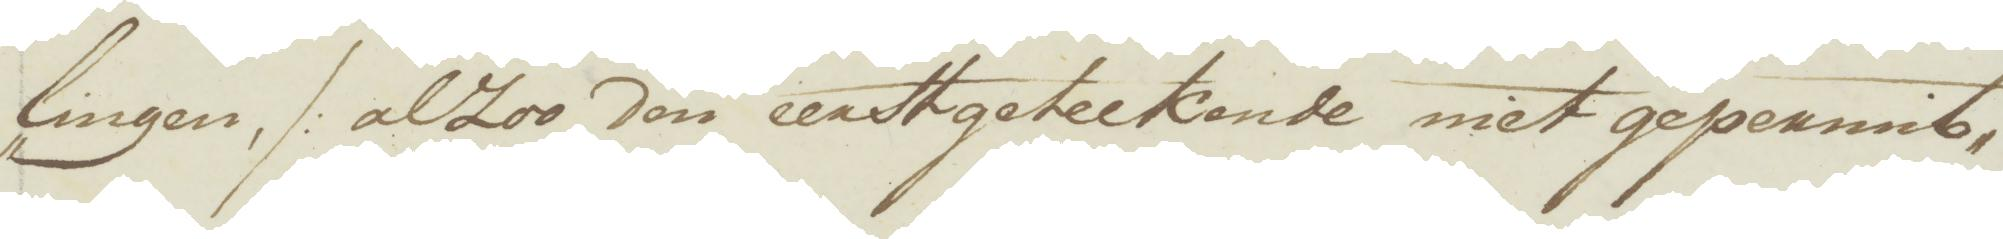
„lingen, /: alzoo den eerst geteekende niet gepermit„
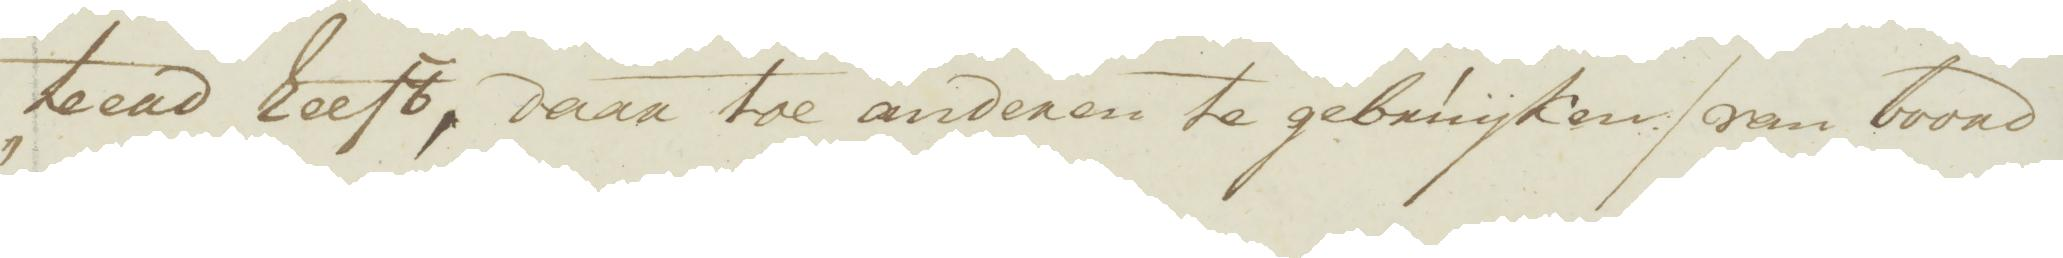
„teerd heeft, daar toe anderen te gebruijken:/ van boord
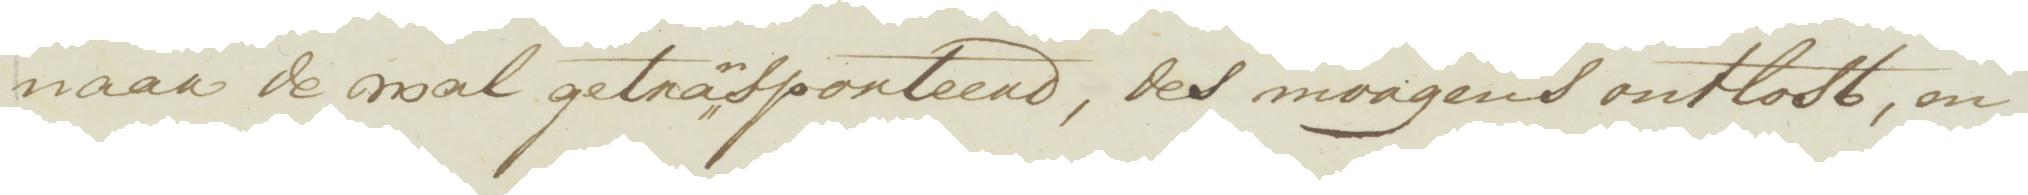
naar de wal getra„sporteerd, des morgens ontlost, en
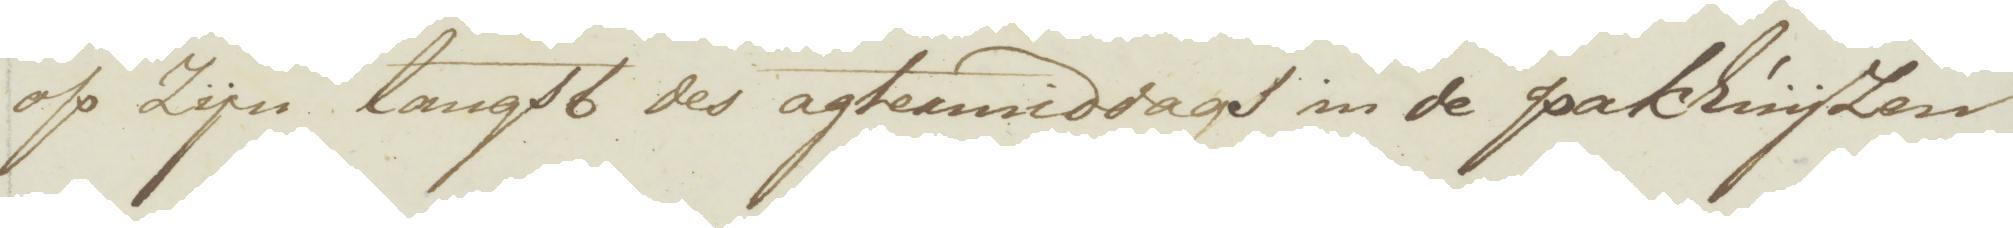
op zijn langst des agtermiddags in de pakhuijzen
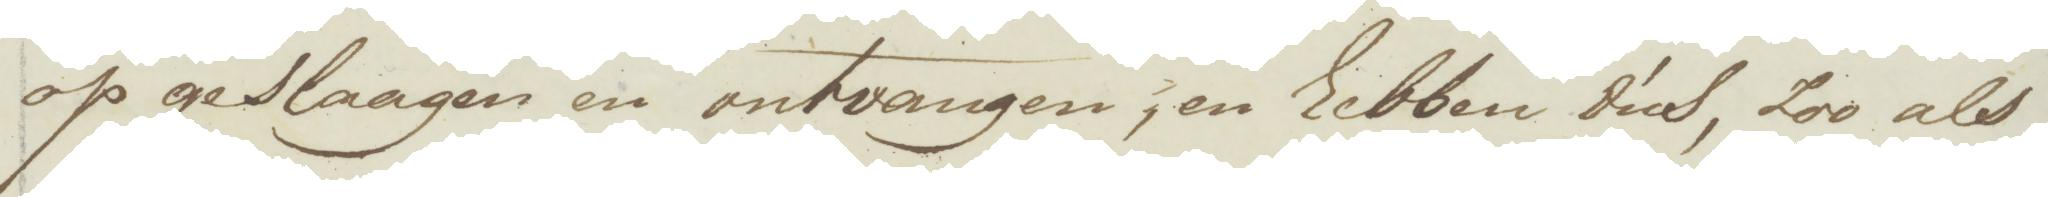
op geslaagen en ontvangen; en hebben dus, zoo als
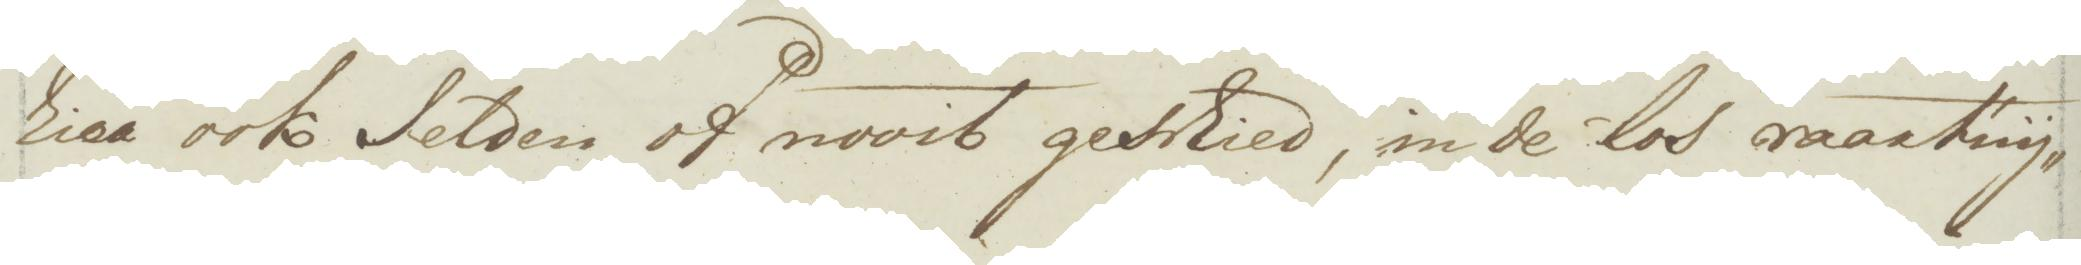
hier ook selden of nooit geschied, in de los vaartuij„
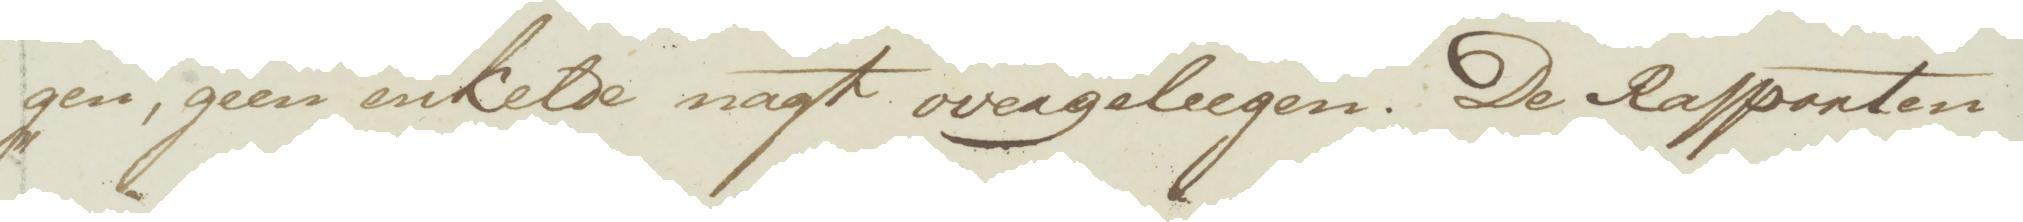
„gen, geen enkelde nagt overgeleegen. De Rapporten
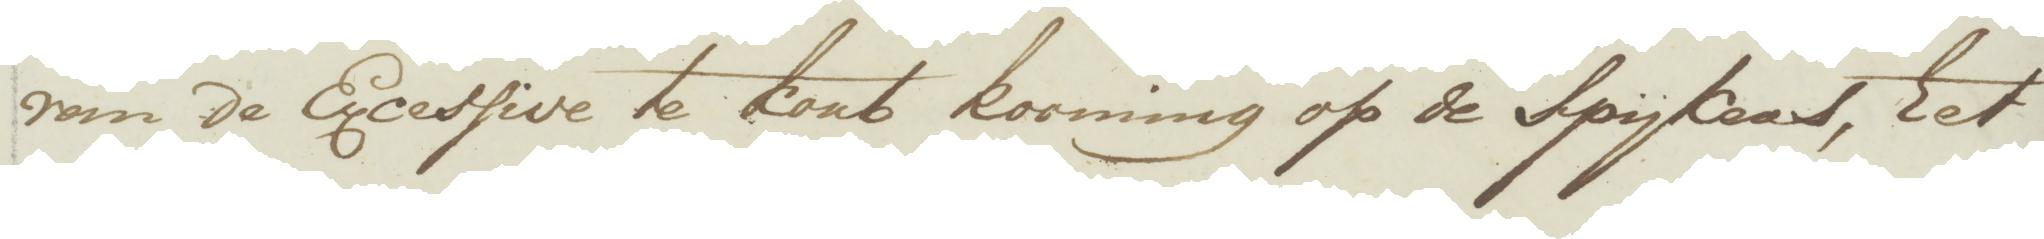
van de Excessive te kort kooming op de spijkers, het
